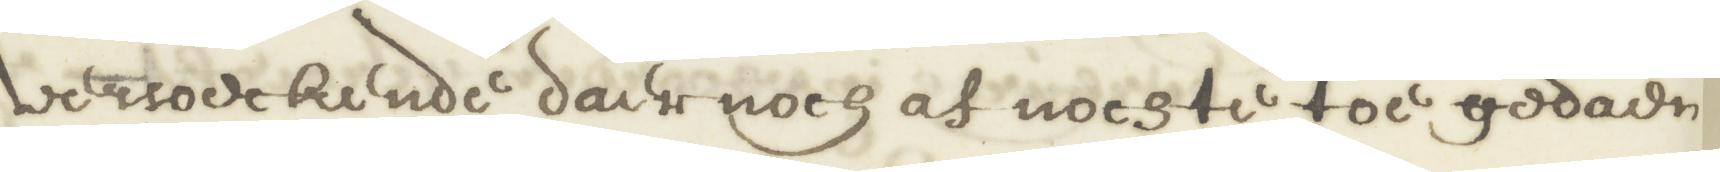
versoeckende daer noch af nochte toe gedaen
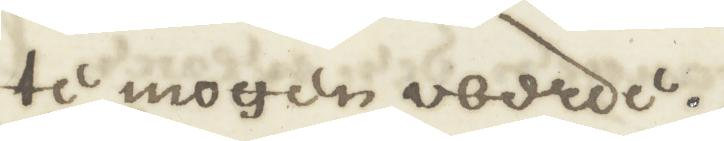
te mogen werde.
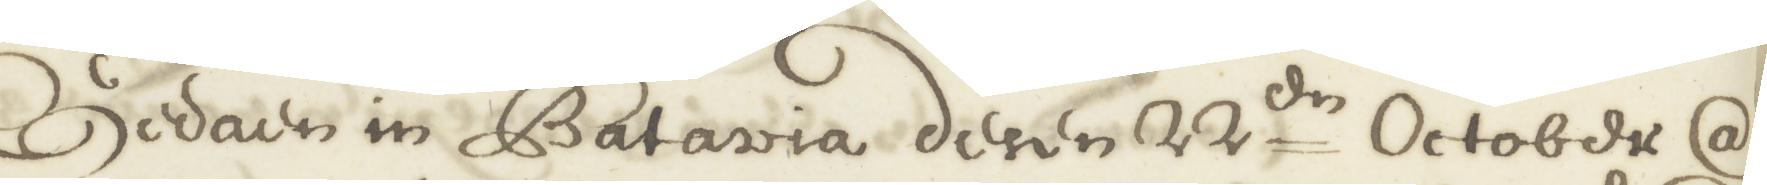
Gedaen in Batavia desen 22=en October @
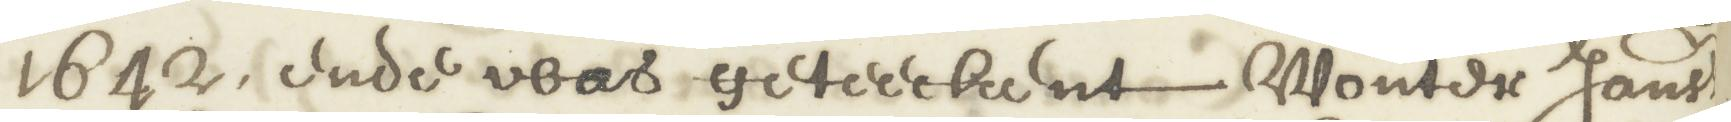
1642, ende was geteeckent Wouter Jans
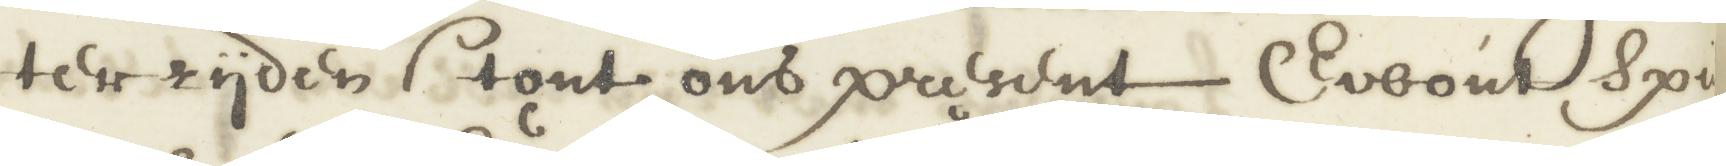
ter zijden stont ons present Ewout spi
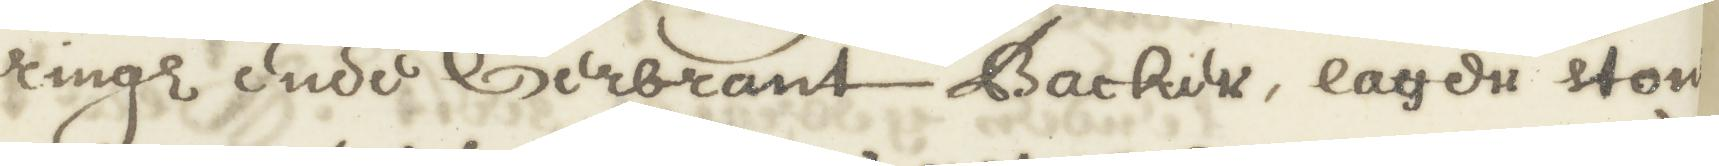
ringh ende Gerbrant Backer, lager ston
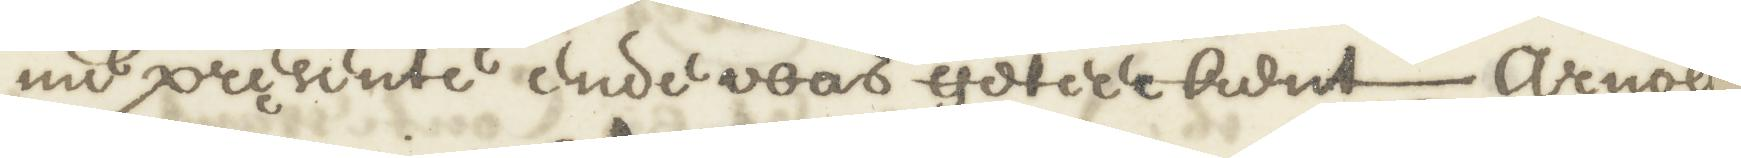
me presente ende was geteeckent Arnol
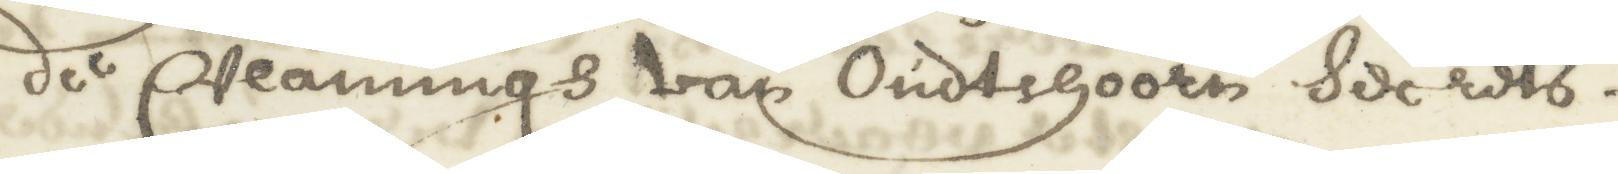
de Vlamings van Oudtshoorn secrets
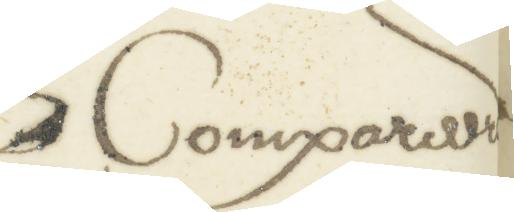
Compareer
